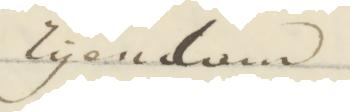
Rijendam
